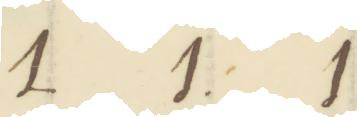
1. 1. 1
